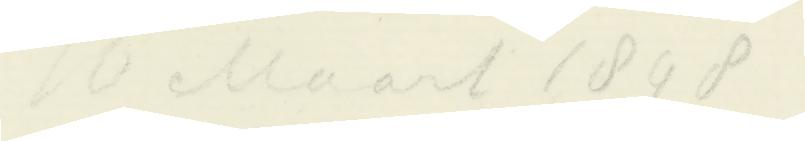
10 Maart 1898
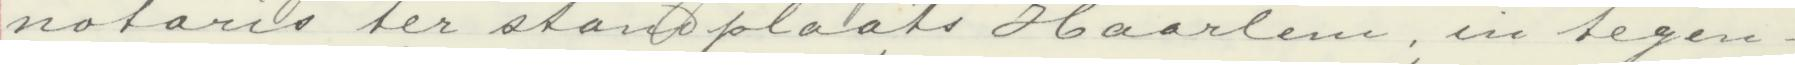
notaris ter standplaats Haarlem, in tegen
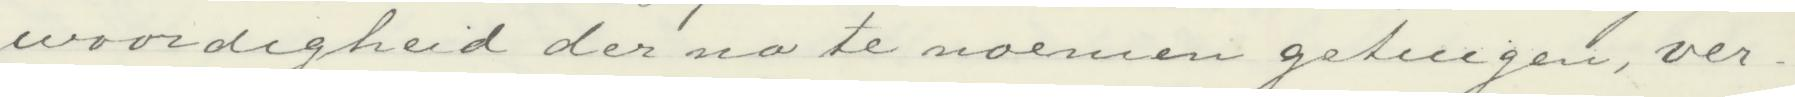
woordigheid der na te noemen getuigen, ver-
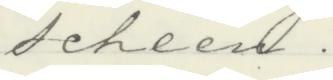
scheen:
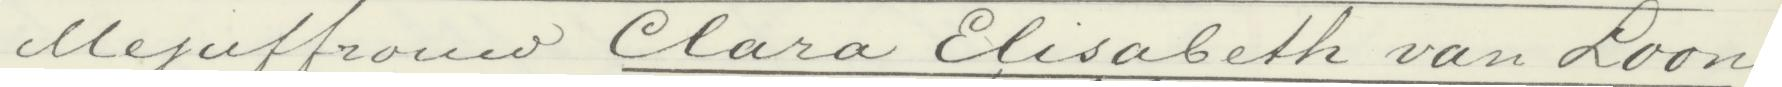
Mejuffrouw Clara Elisabeth van Loon
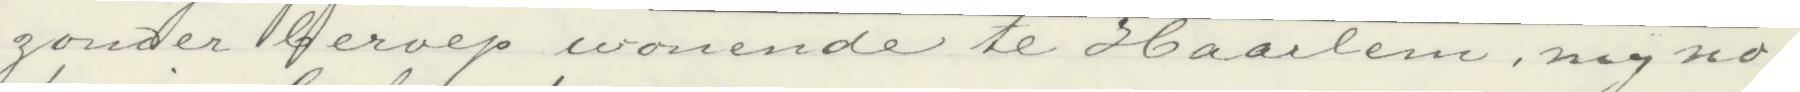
zonder beroep wonende te Haarlem, my no-
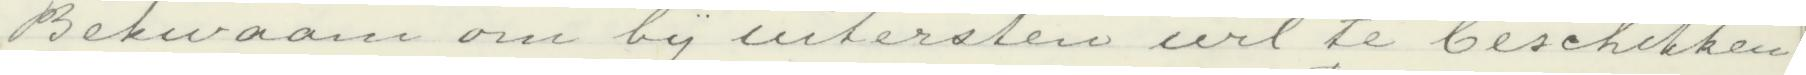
Bekwaam om bij uitersten wil te beschikken
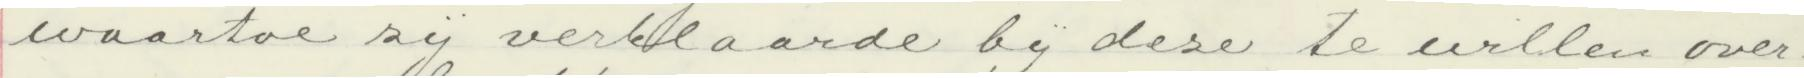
waartoe zij verklaarde bij deze te willen over
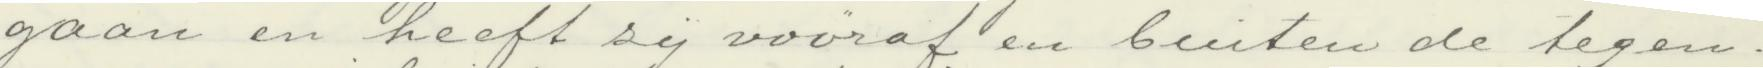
gaan en heeft zij vooraf en buiten de tegen
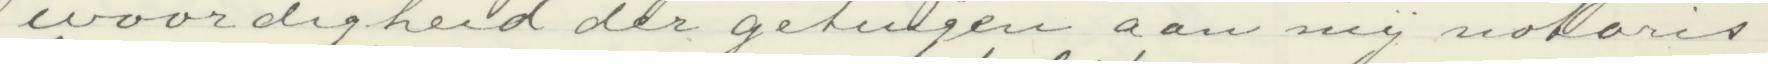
woordigheid der getuigen aan mij notaris
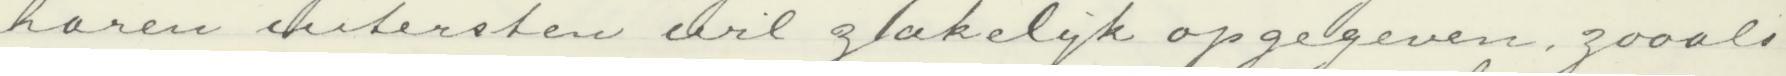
haren uitersten wil zakelijk opgegeven, zooals
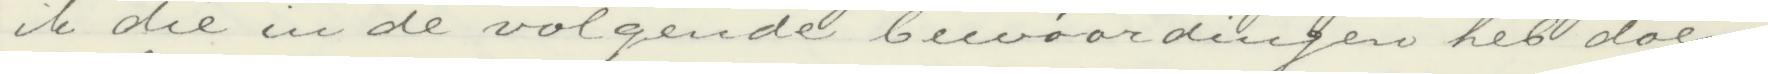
ik die in de volgende bewoordingen heb doen
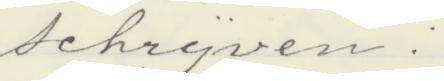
schrijven:
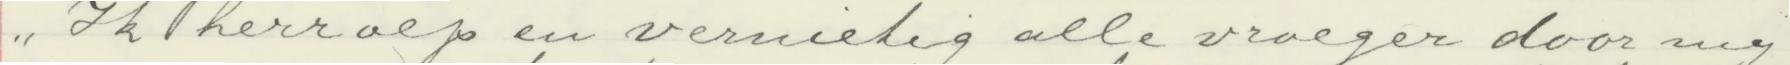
„ Ik herroep en vernietig alle vroeger door mij
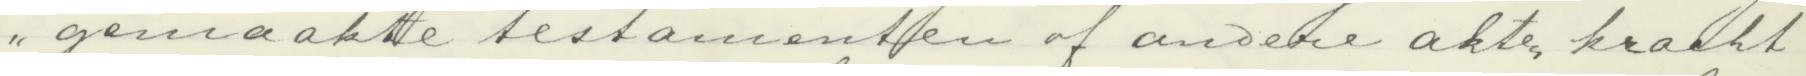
„ gemaakte testamenten of andere akten kracht
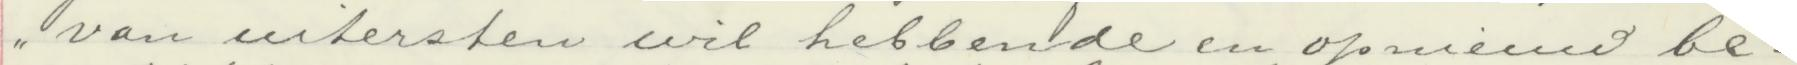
„ van uitersten wil hebbende en opnieuw be-
